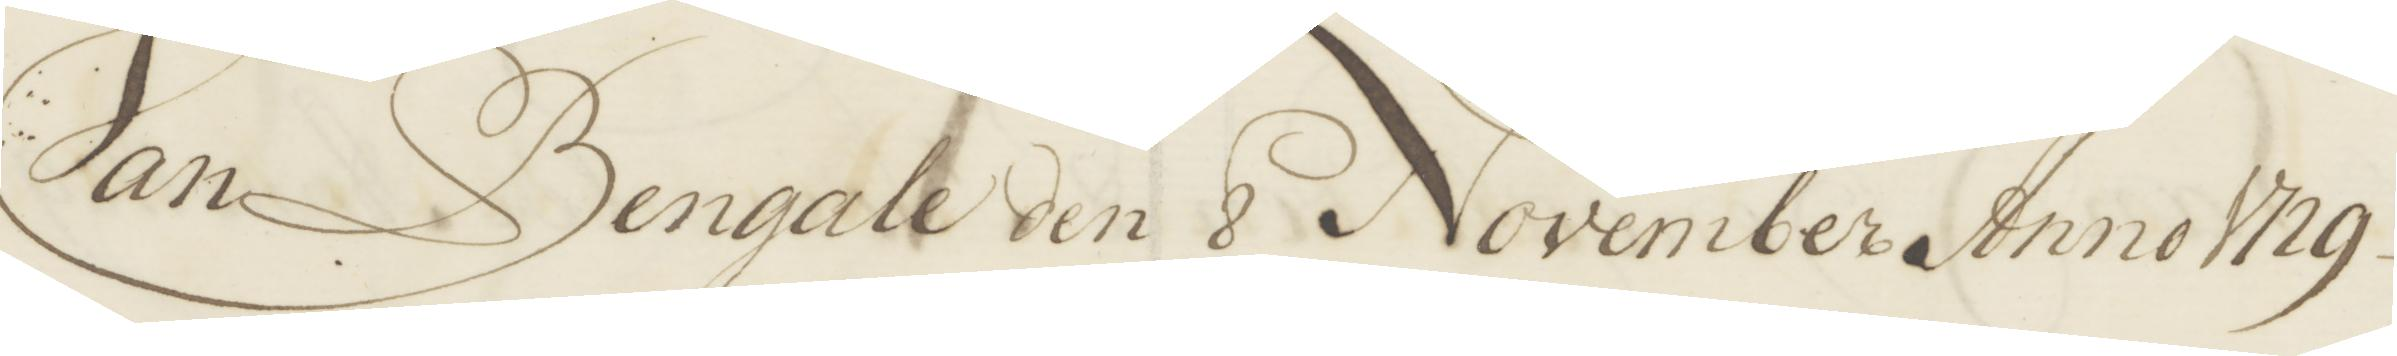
Van Bengale den 8 November Anno 1729
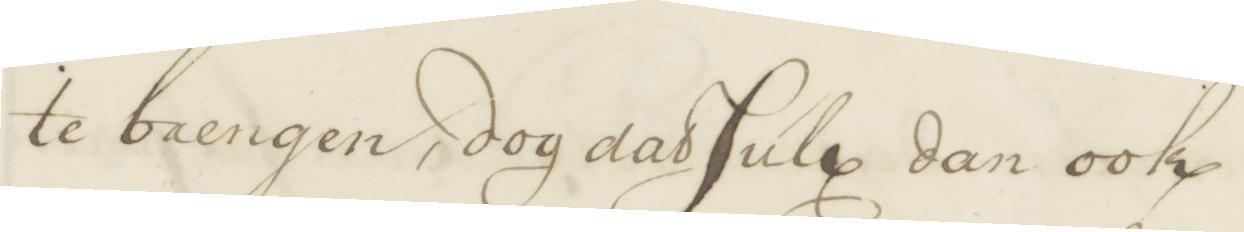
te brengen, dog dat sulx dan ook
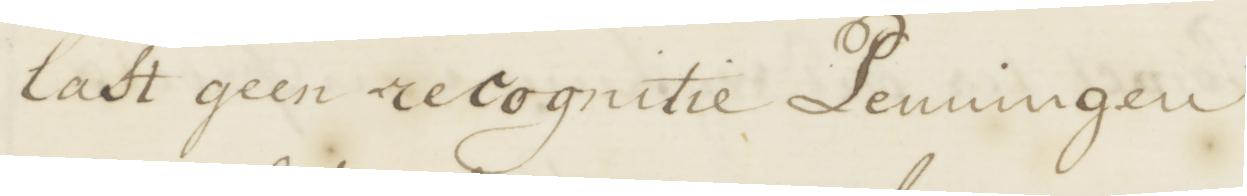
last geen recognitie Penningen
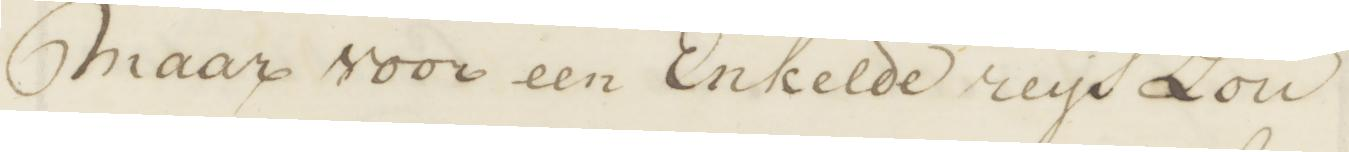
maar voor een Enkelde reijs zou
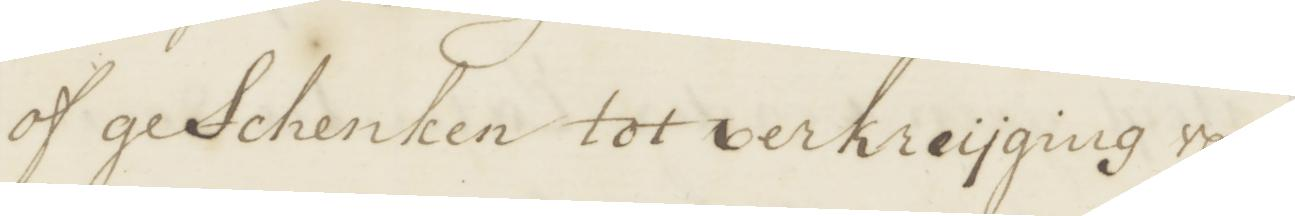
of geschenken tot verkreijging van
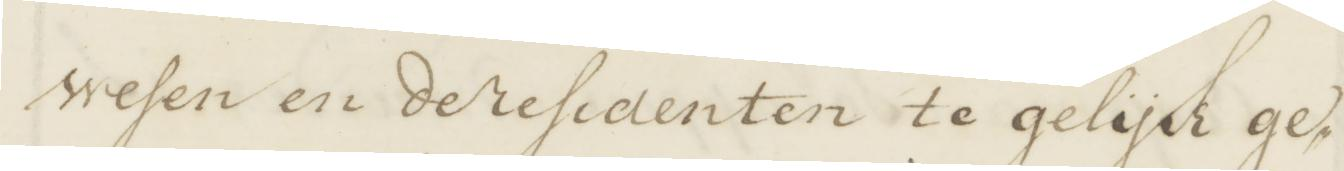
wesen en de residenten te gelijk ge„
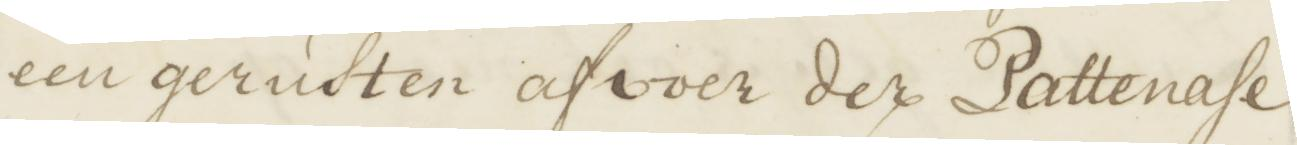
een gerusten afvoer der Pattenase
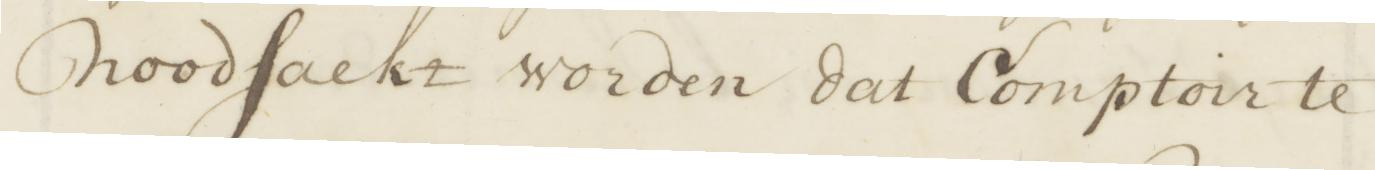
noodsaekt worden dat Comptoir te
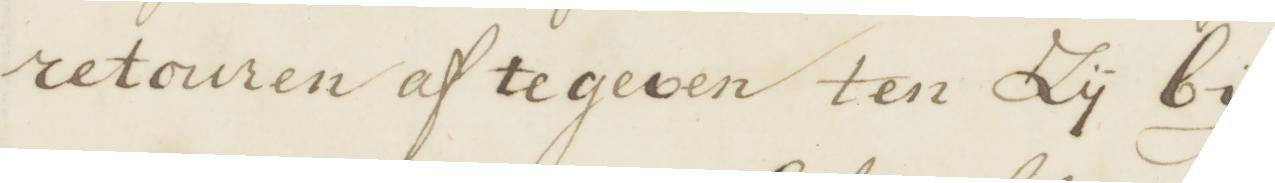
retouren af te geven ten zij bij
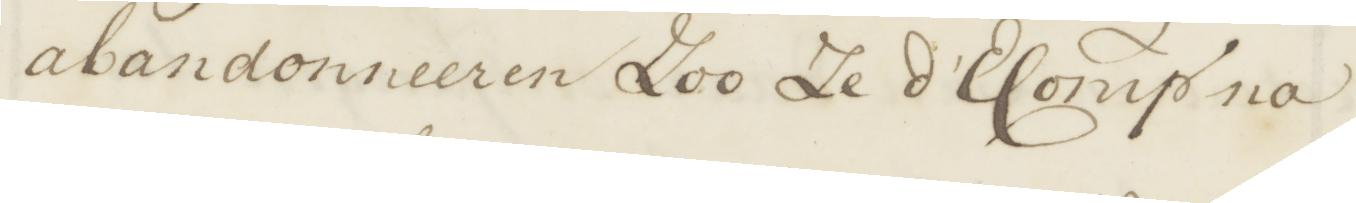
abandonneeren zoo ze d’EComp na
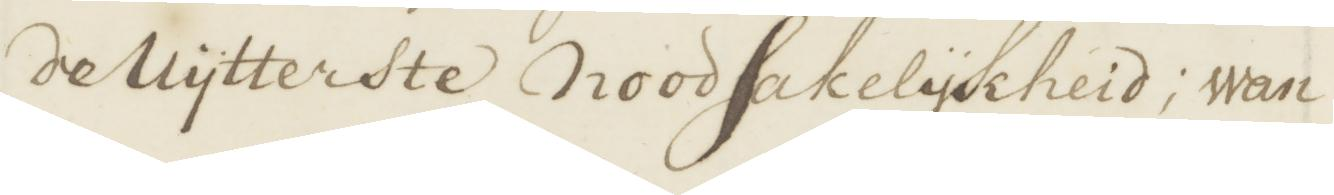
de Uijtterste noodsakelijkheid; wan
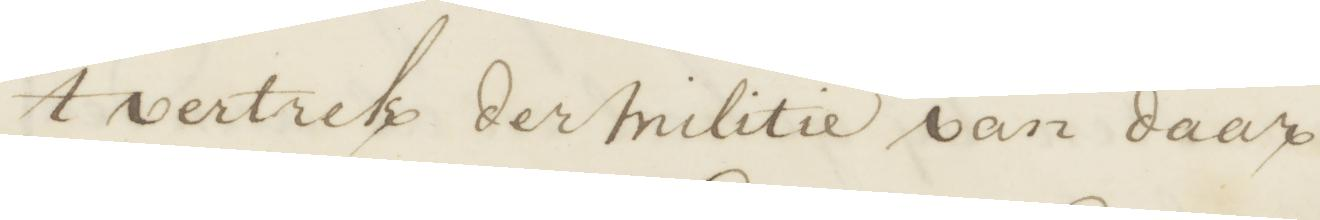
’t vertrek der militie van daar
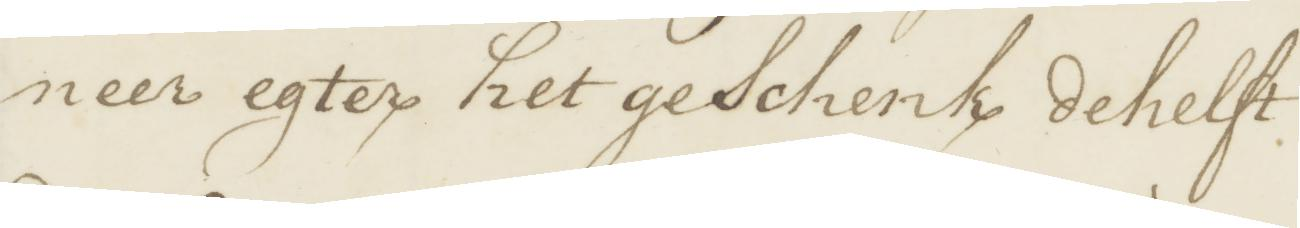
neer egter het geschenk de helft
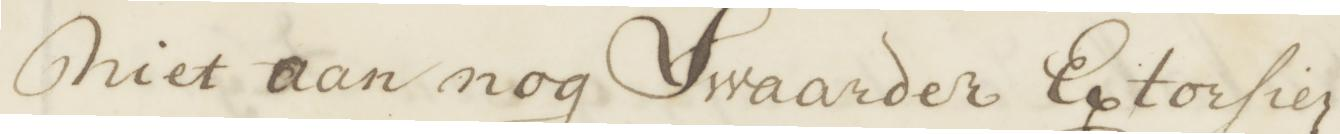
niet aan nog Swaarder Extorsien
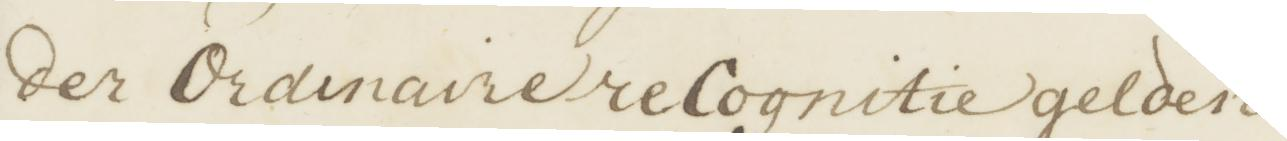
der Ordinaire recognitie gelden
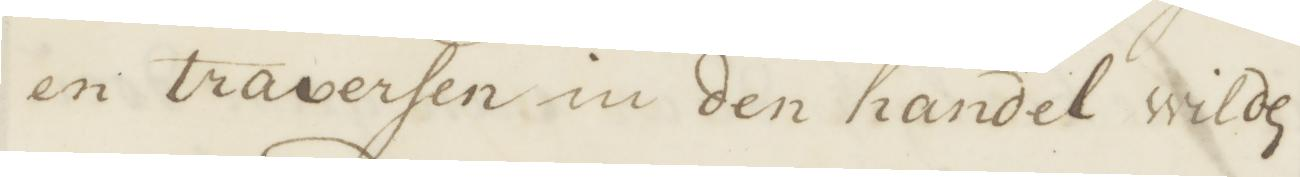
en traversen in den handel wilde
